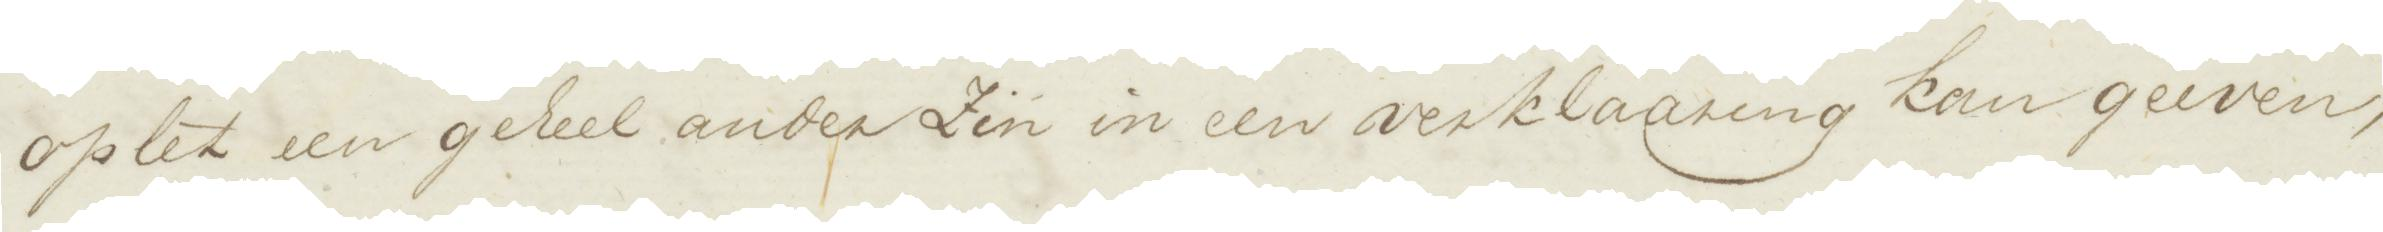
oplet een geheel ander zin in een verklaaring kan geeven
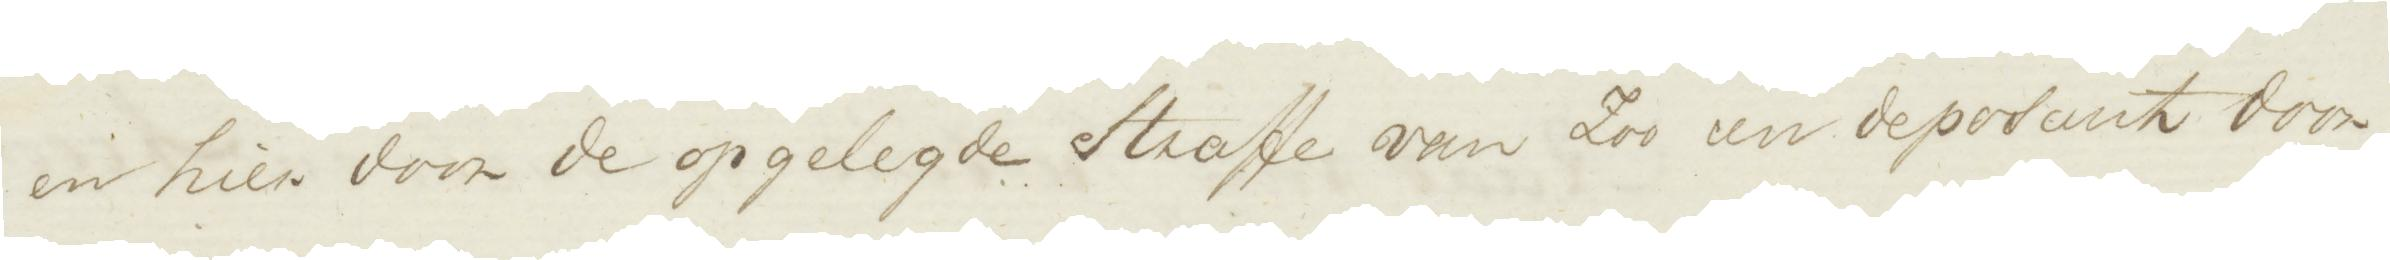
en hier door de opgelegde straffe van zoo een deposant door
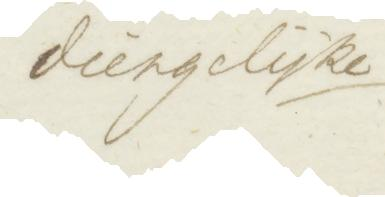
diergelijke
